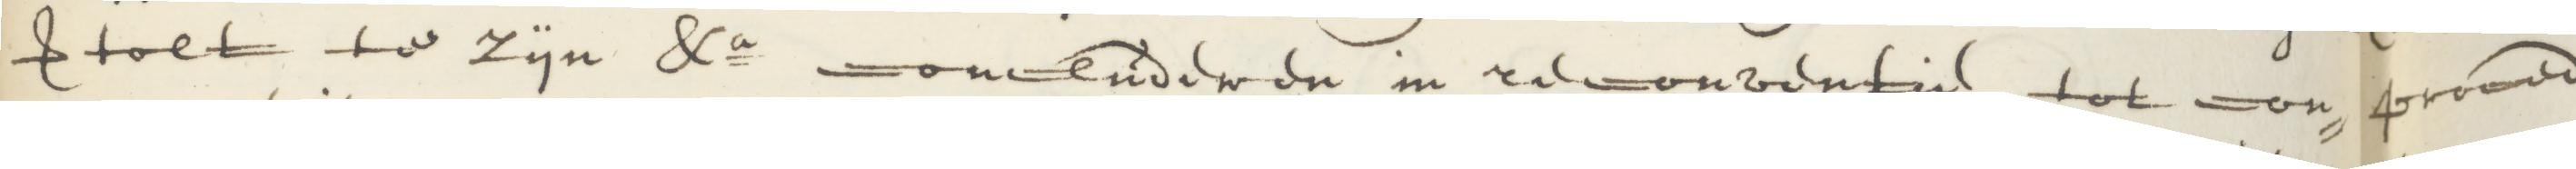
vertolt te zijn Et=a concluderen in reconventie tot con
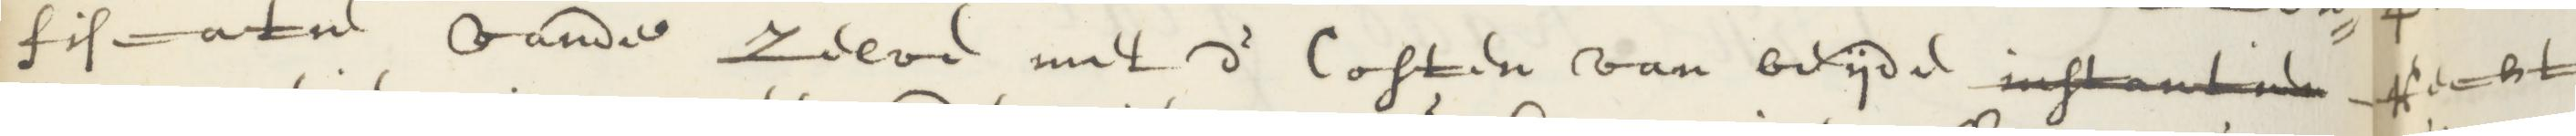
fiscatie vande zelve met d’ costen van beijde instantien
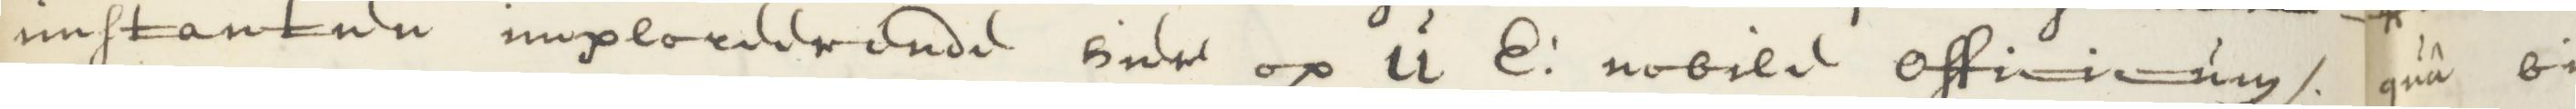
instantien imploreerende hier op U E. nobile officicum,.
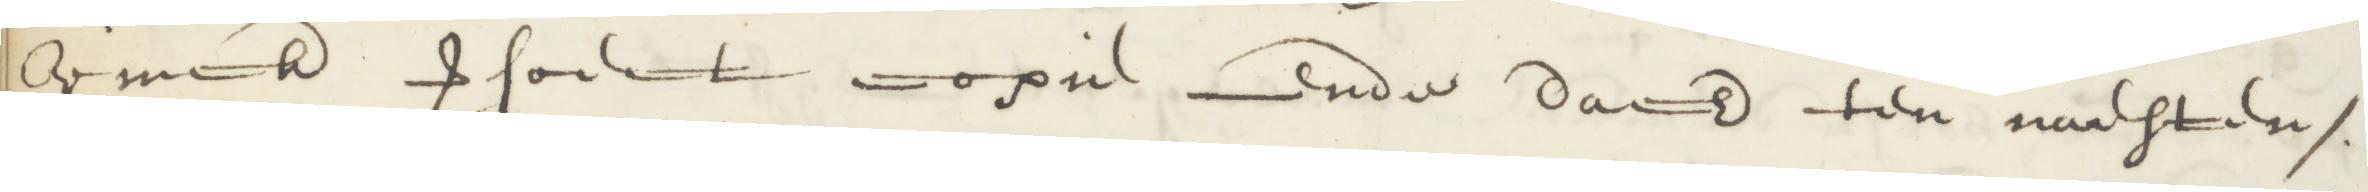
Vinck versoekt copie ende dach ten naesten,.
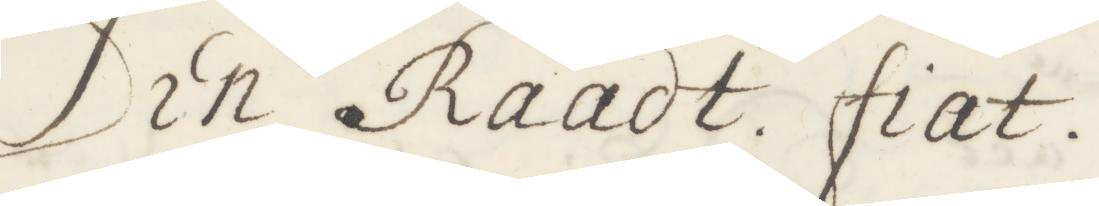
Den Raadt. fiat.
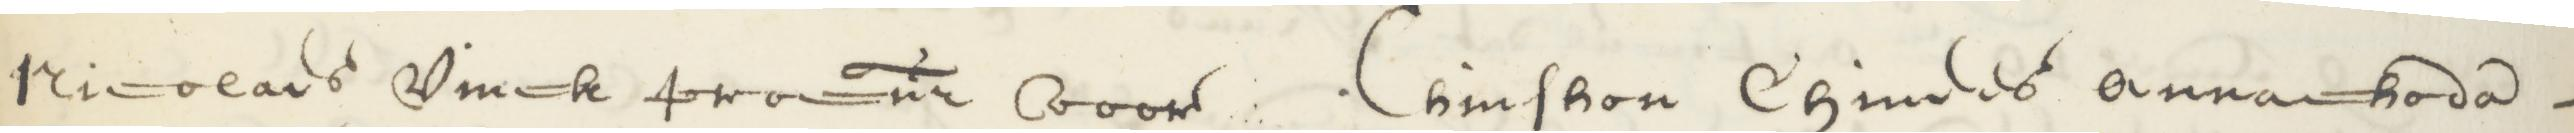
Nicolaes Vinck procur voor Chinshon Chinees annachoda
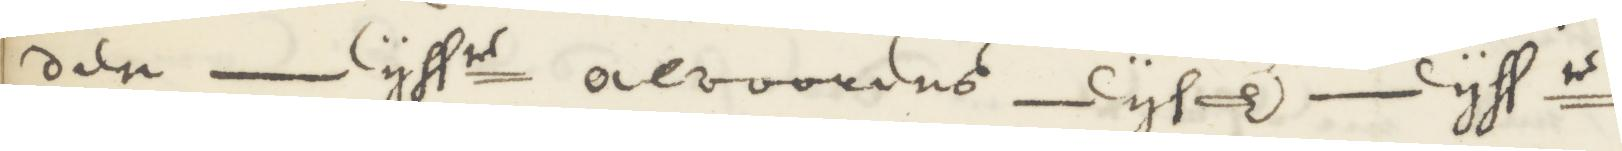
den eijss=r alvoorens eijsch eijss=r
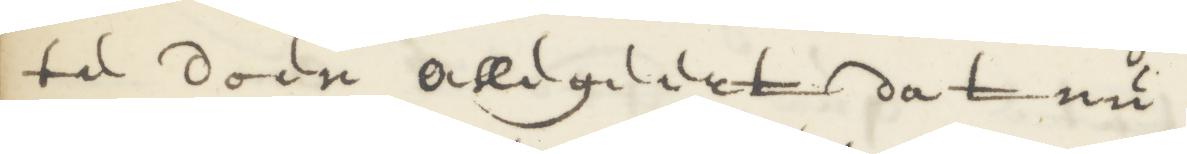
te doen allegeert dat nu
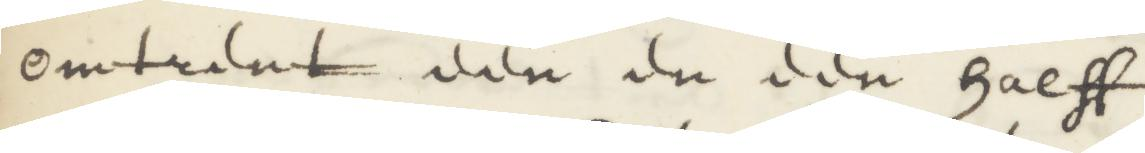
omtrent een en een halff
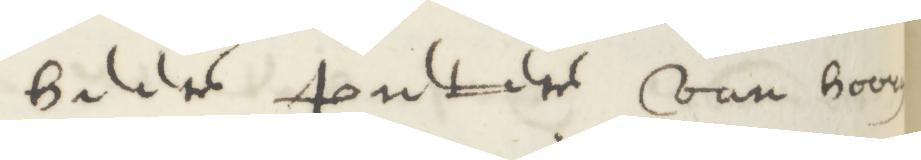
heer pieter van hoor
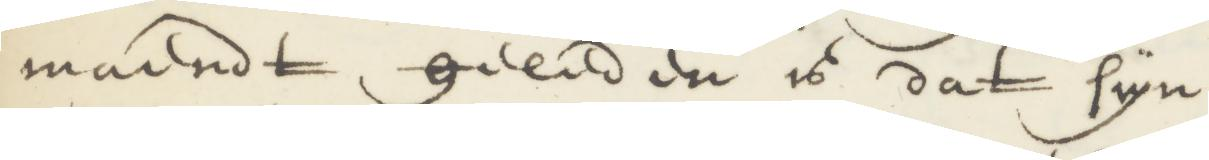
maendt geleden is dat sijn
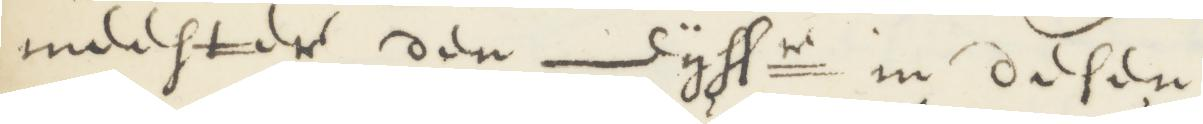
meester den eijss=r in desen
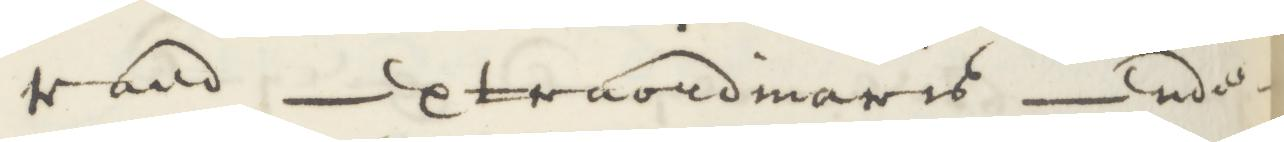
raed extraordinaris ende
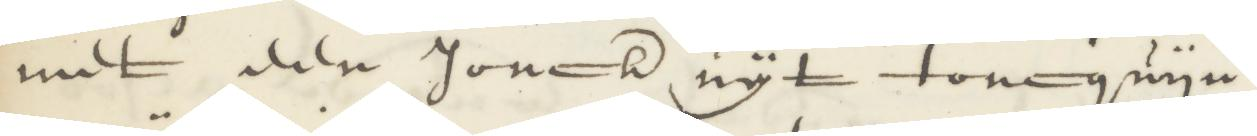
met een Jonck uijt toncquijn
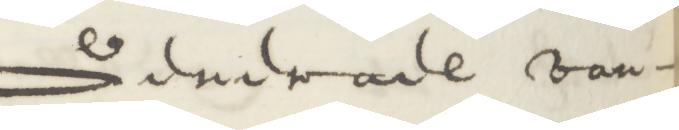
Generael van
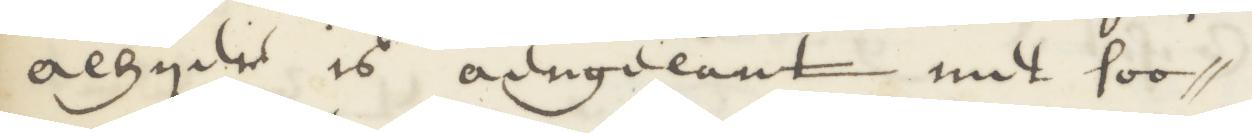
alhijer is aengelant met soo„
